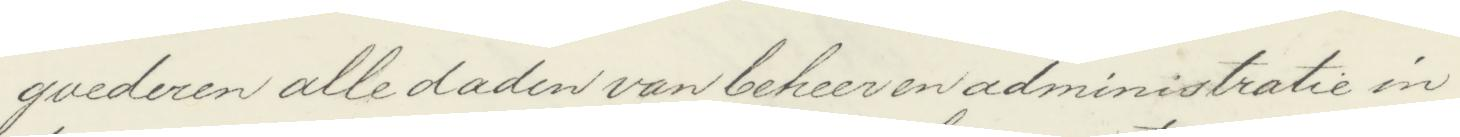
goederen alle daden van beheer en administratie in
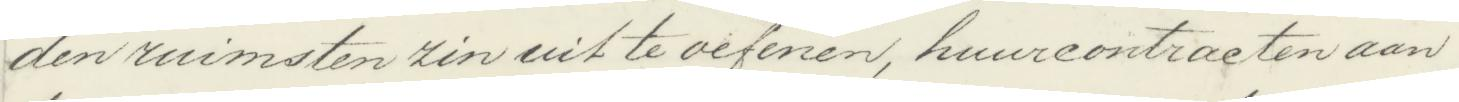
den ruimsten zin uit te oefenen, huurcontracten aan
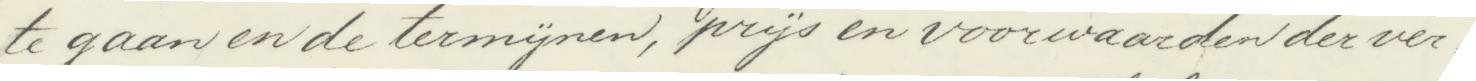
te gaan en de termijnen, prijs en voorwaarden der ver„
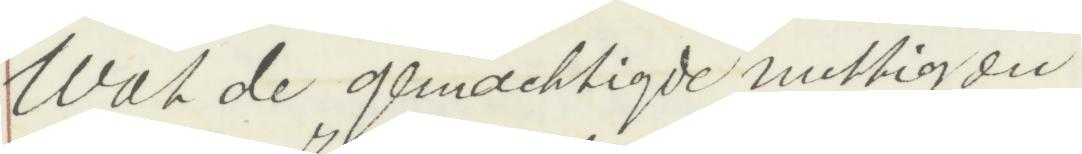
Wat de gemachtigde nuttig en
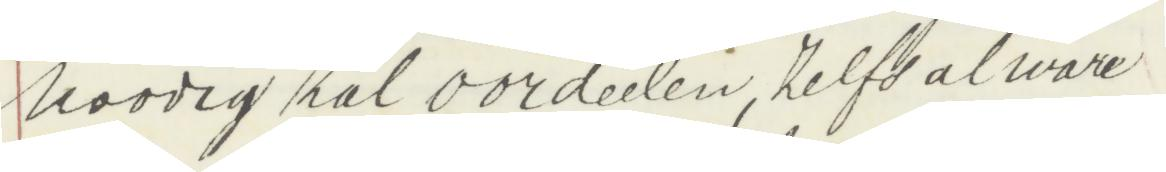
noodig zal oordeelen, zelfs al ware
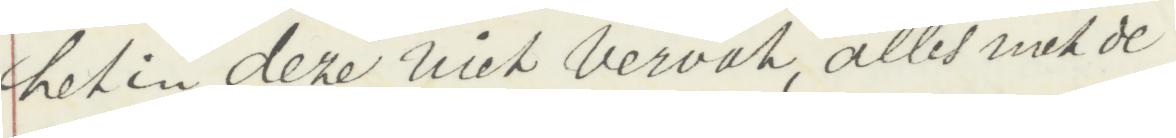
het in deze niet vervat, alles met de
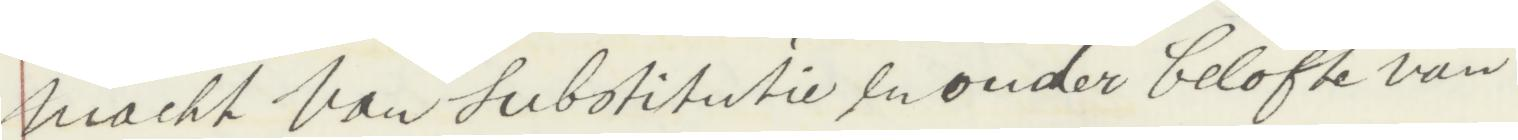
macht van substitutie en onder belofte van
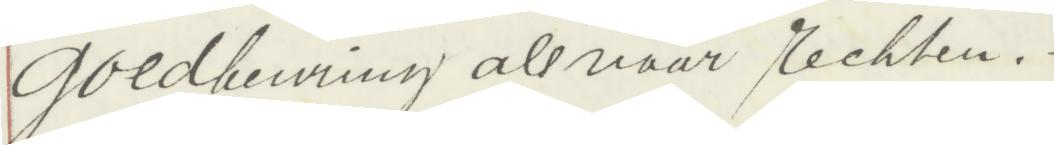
Goedkeuring als naar Rechten.
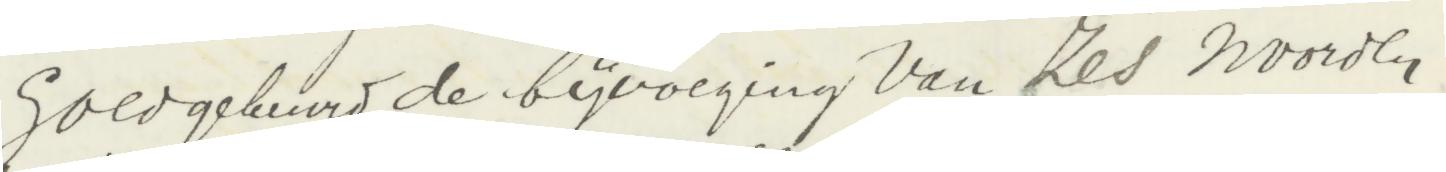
Goedgekeurd de bijvoeging van zes woorden
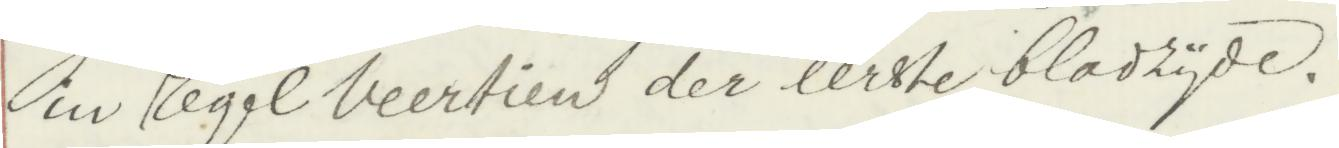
in regel veertien der eerste bladzijde.
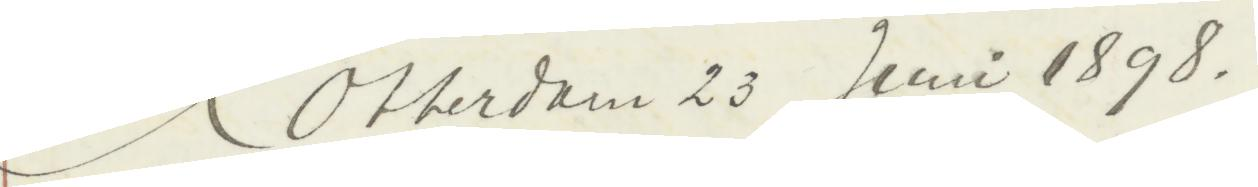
Rotterdam 23 Juni 1898.
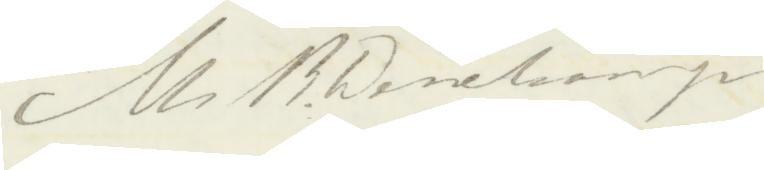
M B Denekamp
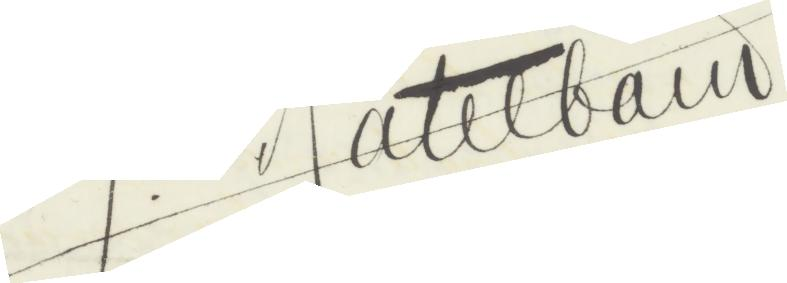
J. Ratelband
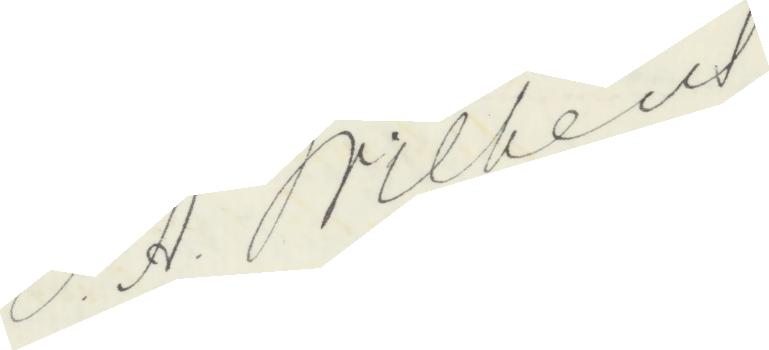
I.A. Wilkens
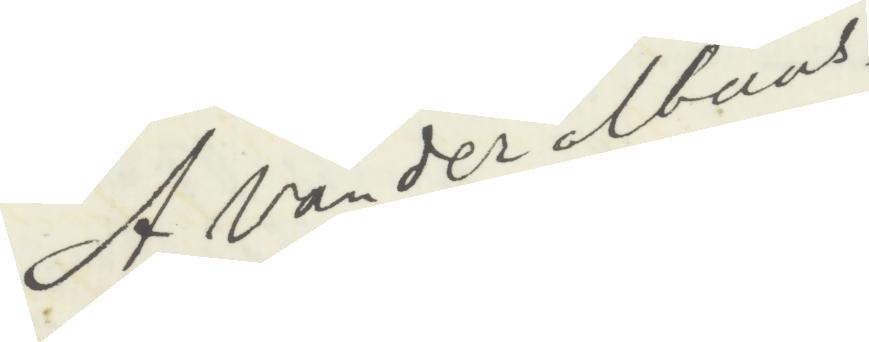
A Van der Maas
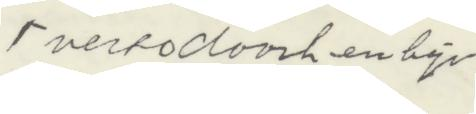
¶ verso doorh en bijv
